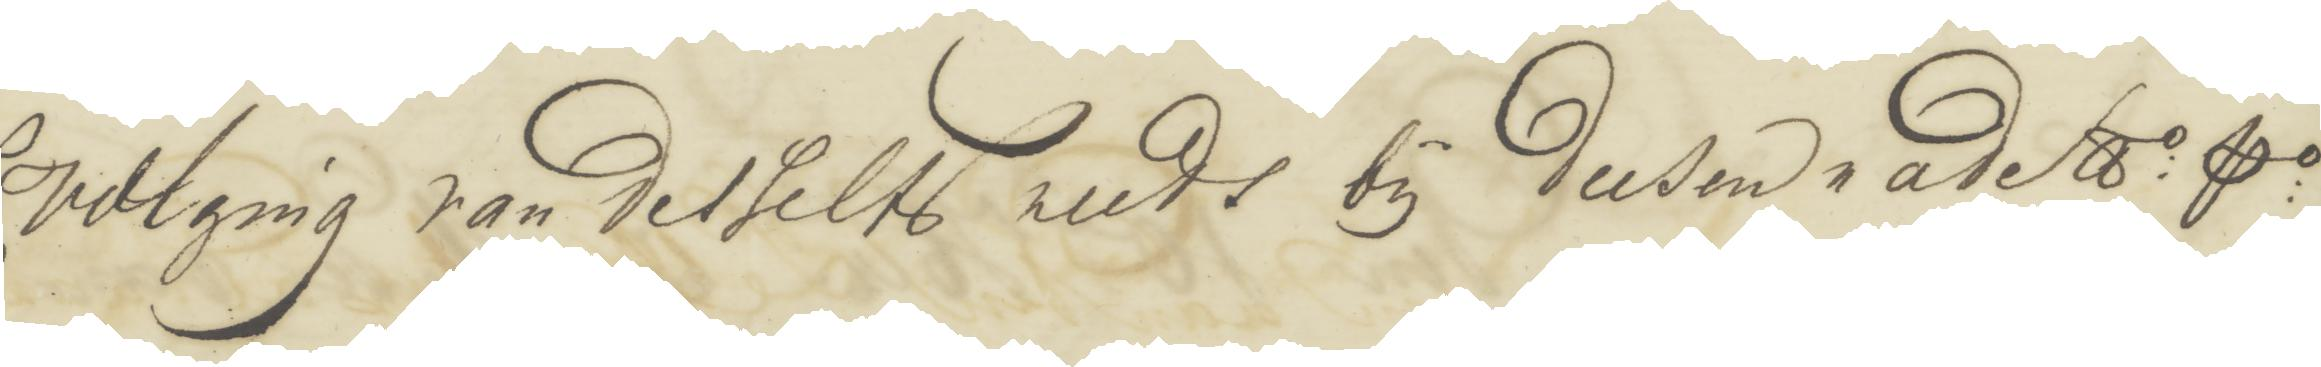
volging van desselfs reeds bij deesen rade a:o p:o
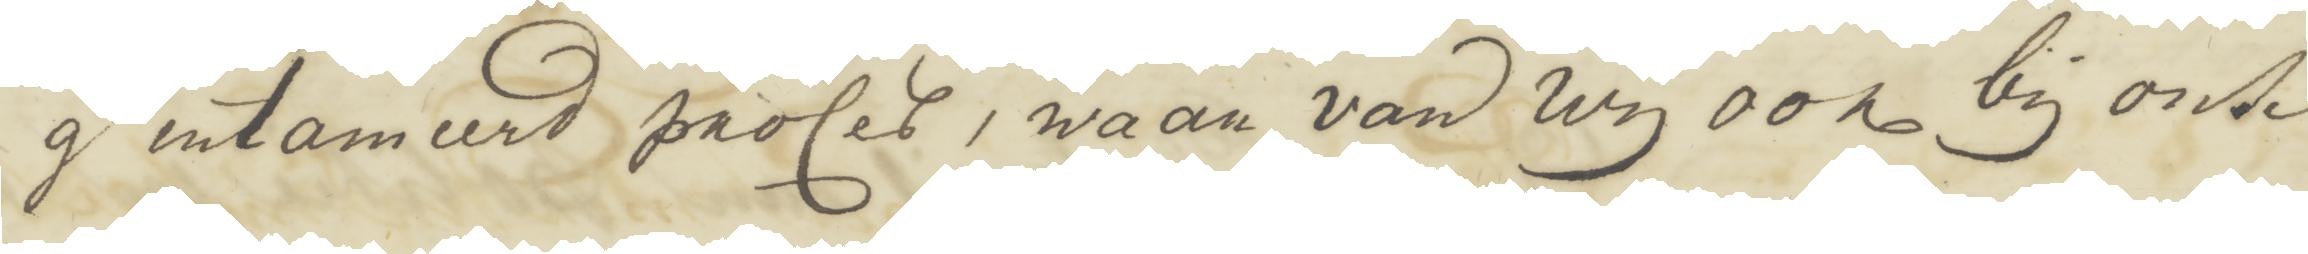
g’entameerd proces, waar van wij ook bij onse
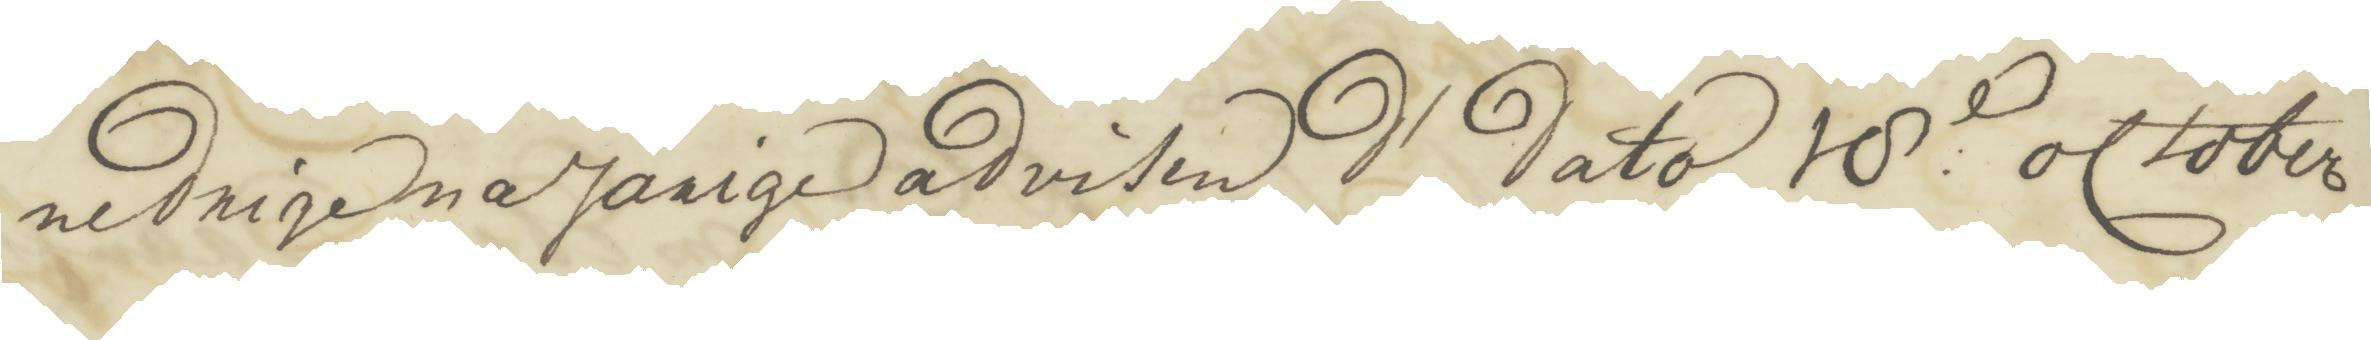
nedrige najarige advisen d’ dato 18:e october
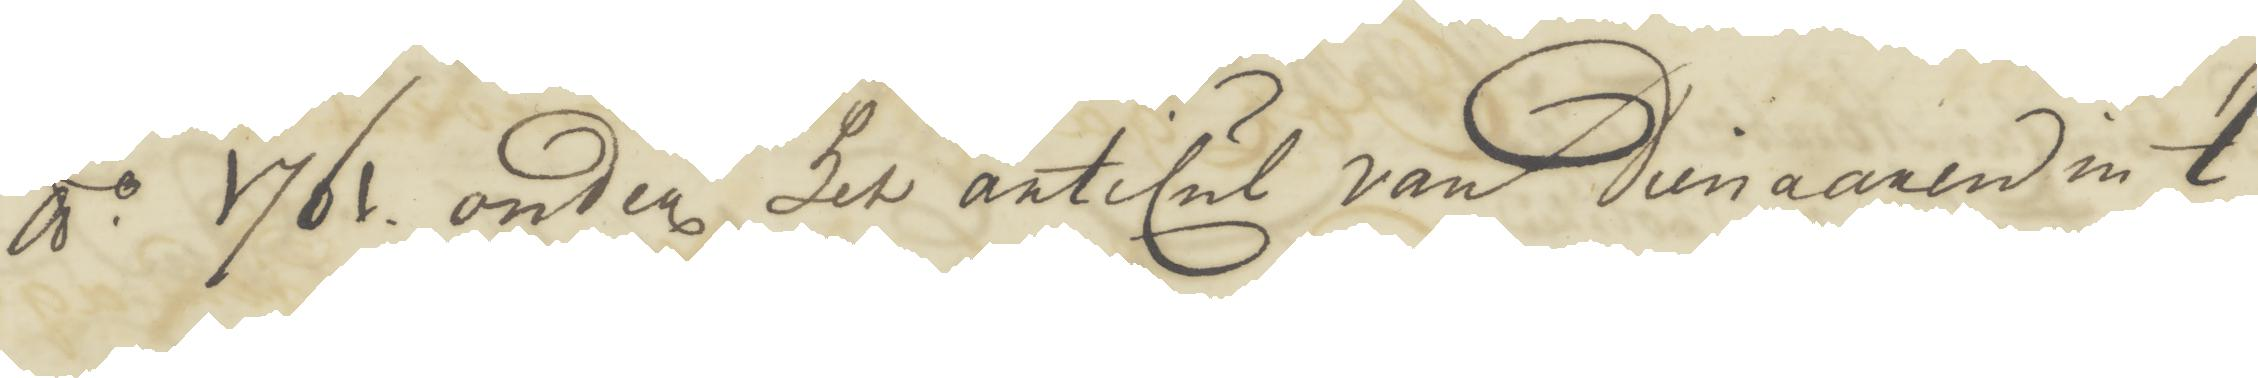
a.o 1761. onder het articul van dienaaren in ’t
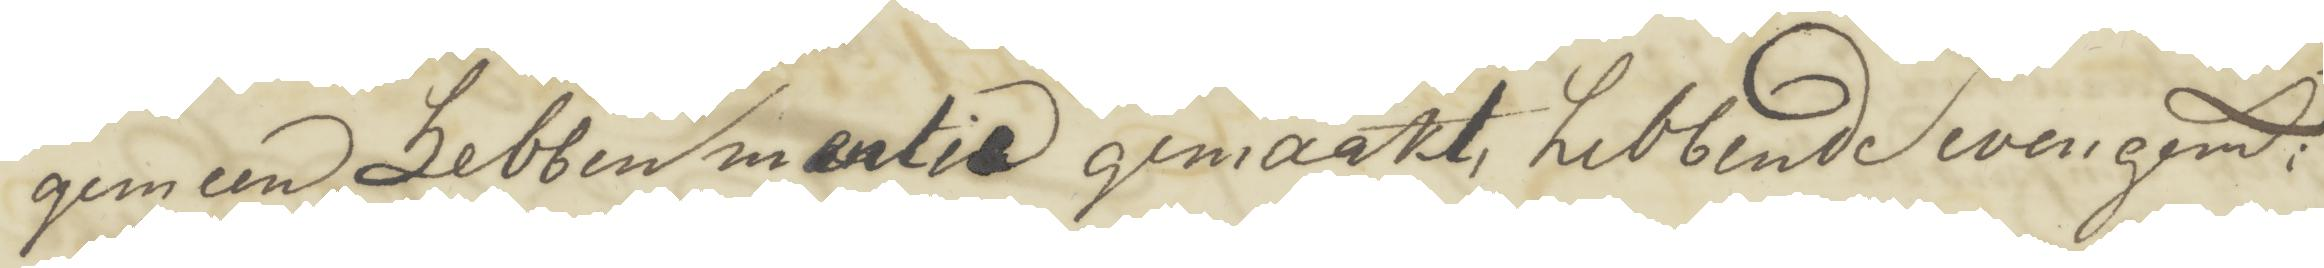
gemeen hebben mentie gemaakt, hebbende evengem:
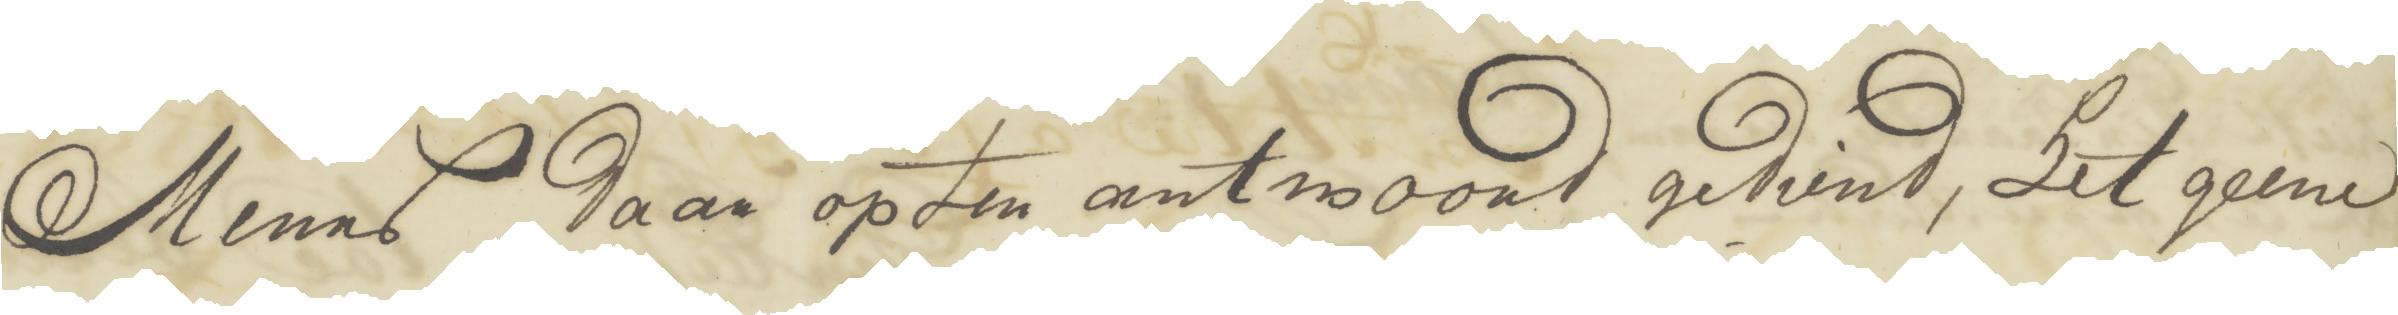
Meurs daar op ten antwoord gediend, het geene
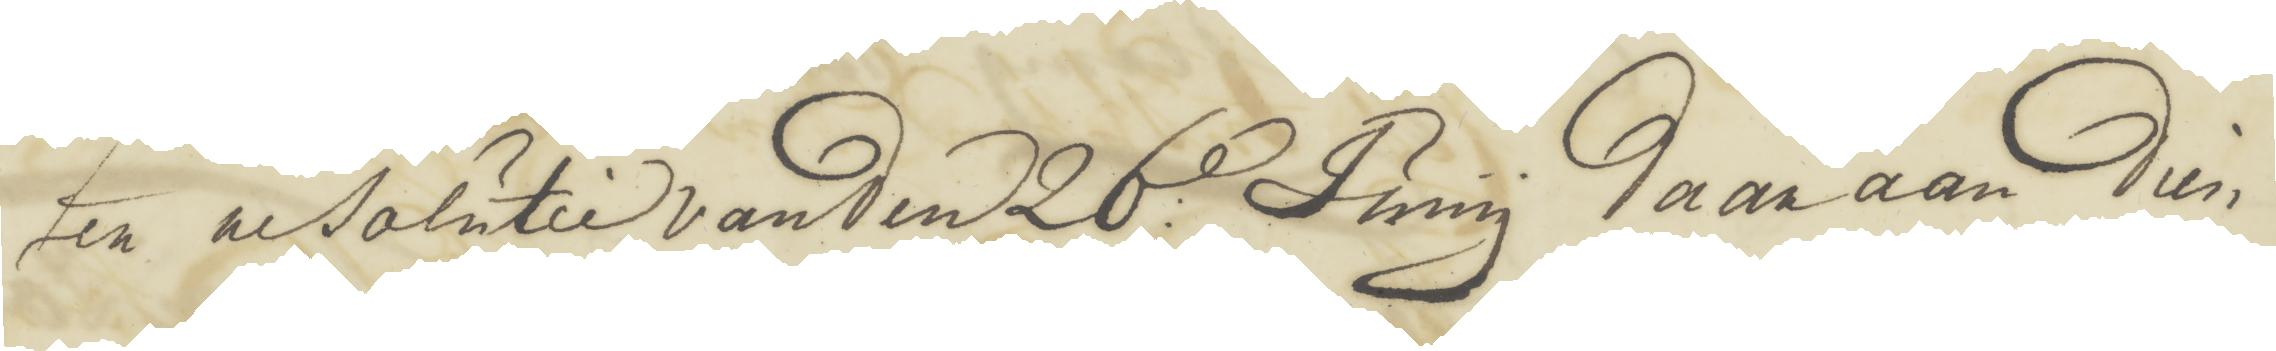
ter resolutie van den 26:e Iunij daar aan dien
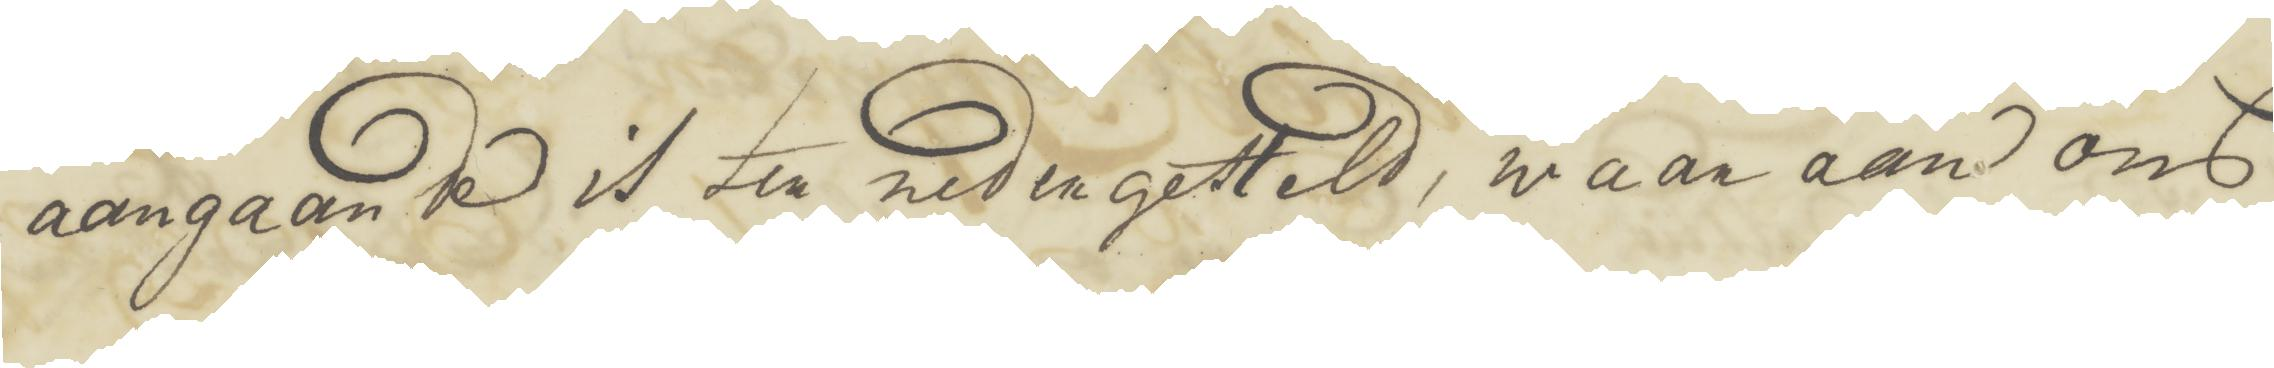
aangaande is ter nedergesteld, waar aan ons
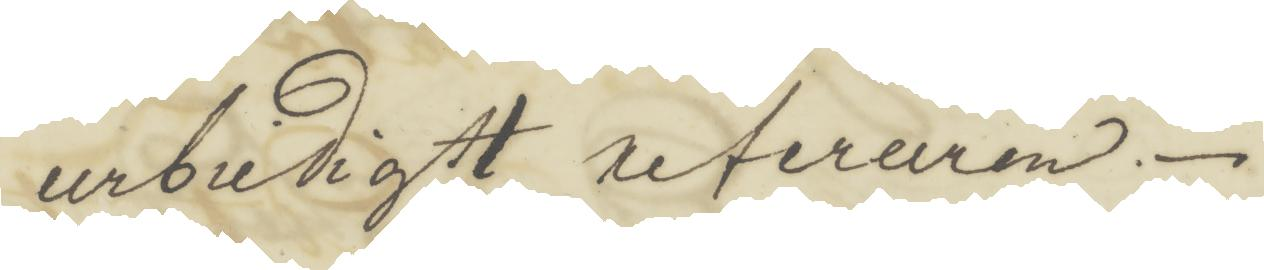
eerbiedigst refereeren.—
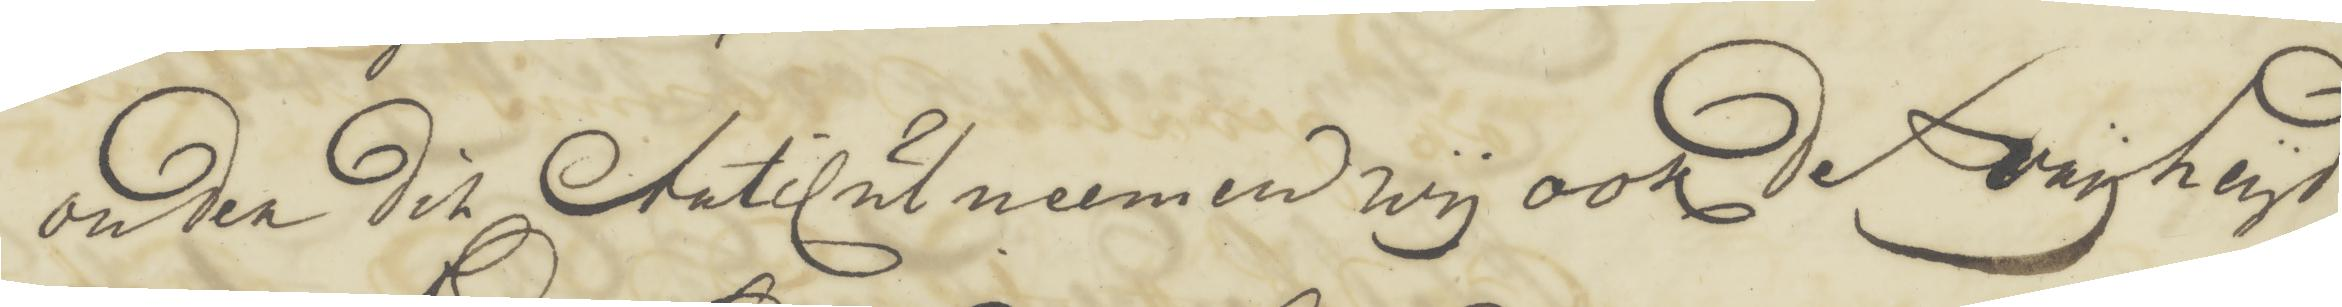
onder dit Articul neemen wij ook de vrijheijd
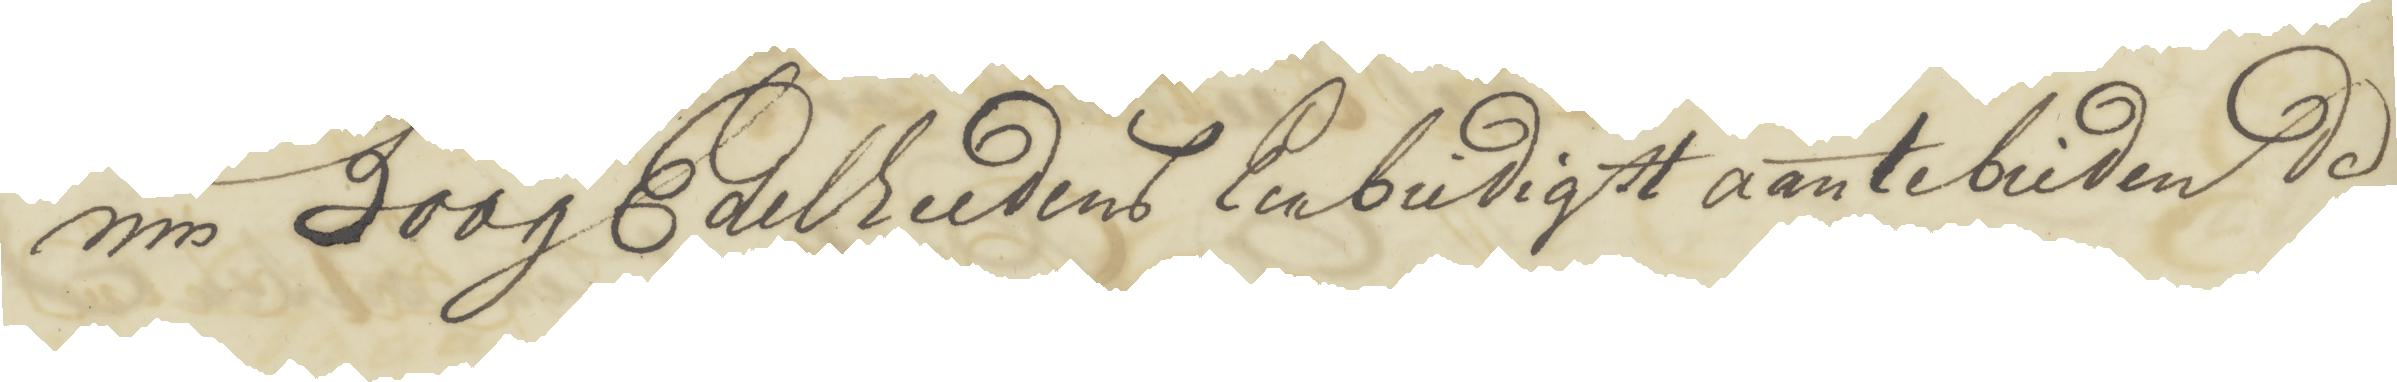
uw Hoog Edelheedens Eerbiedigst aan te bieden de
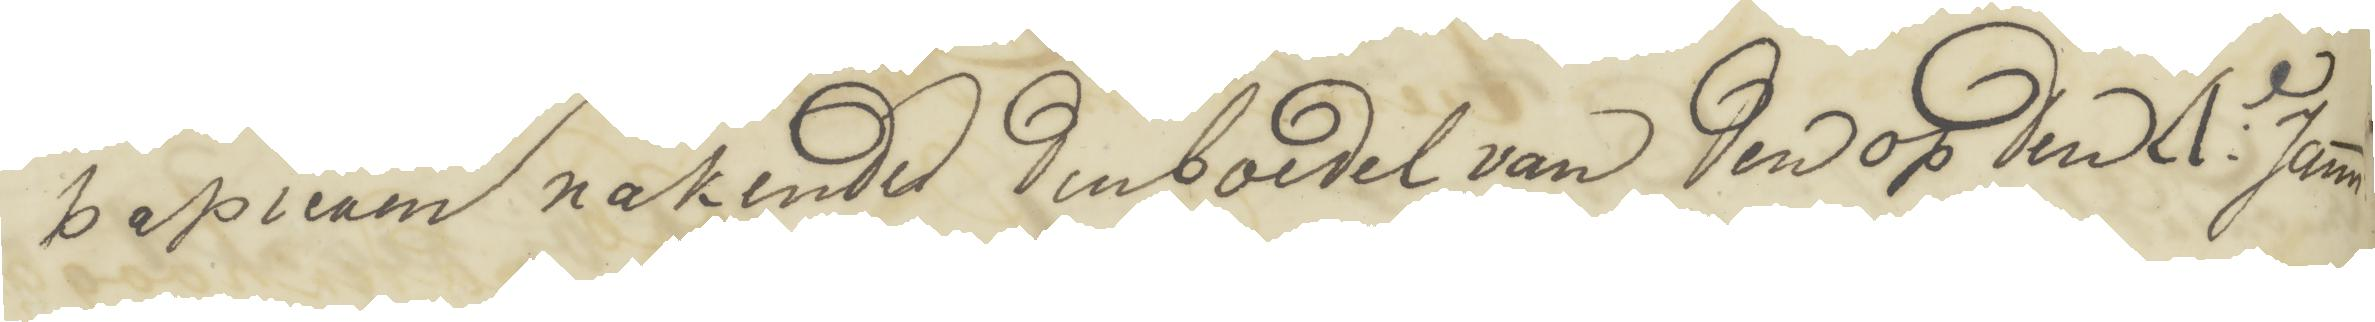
papieren nakende den boedel van den op den 4:e Janu
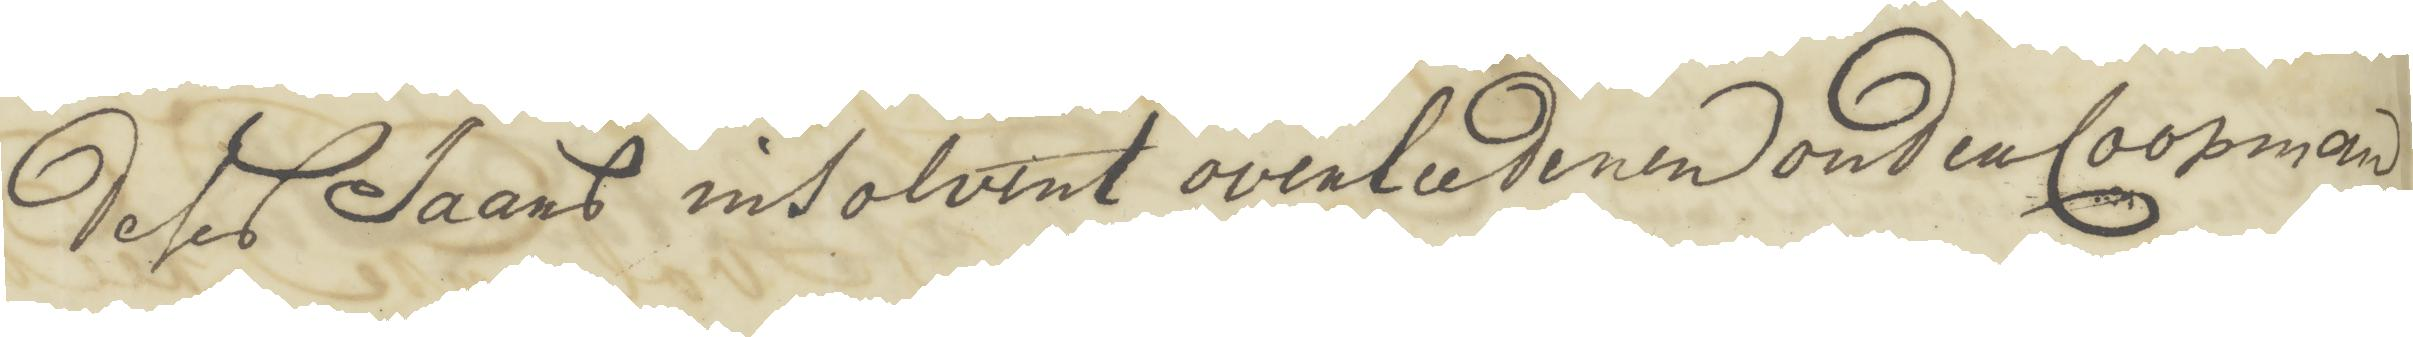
deses Iaars insolvent overleedenen onderCoopman
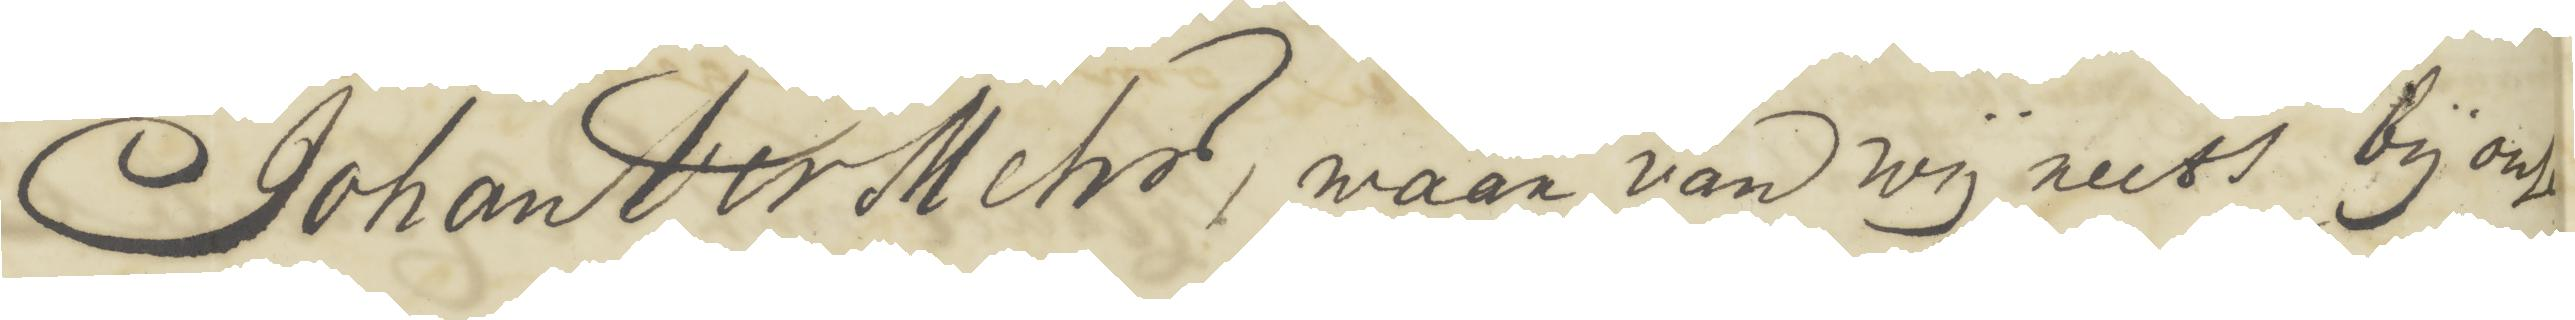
Iohan VerMehr, waar van wij reets bij onse
